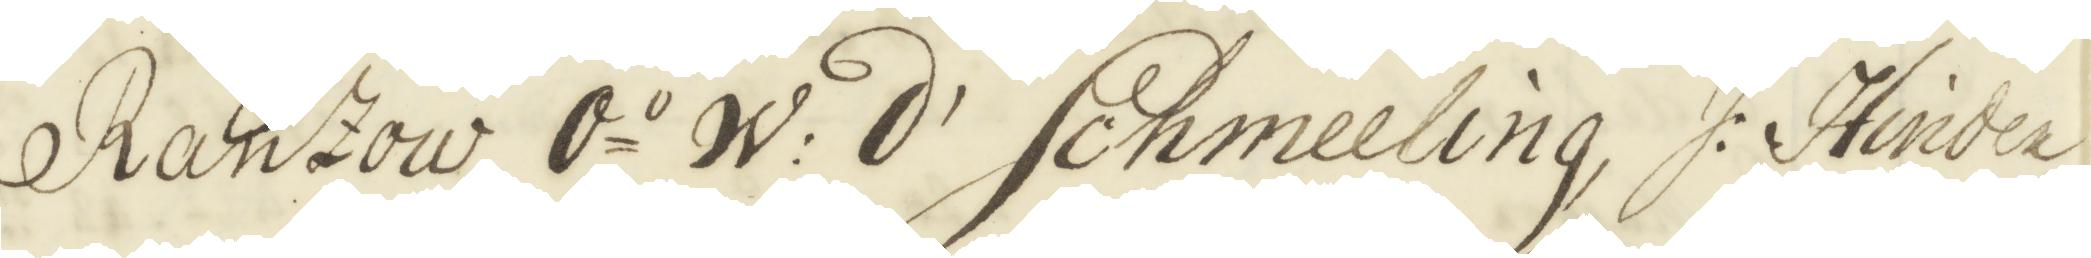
Ranzow O=o W: d’ Schmeeling, J: Hinder
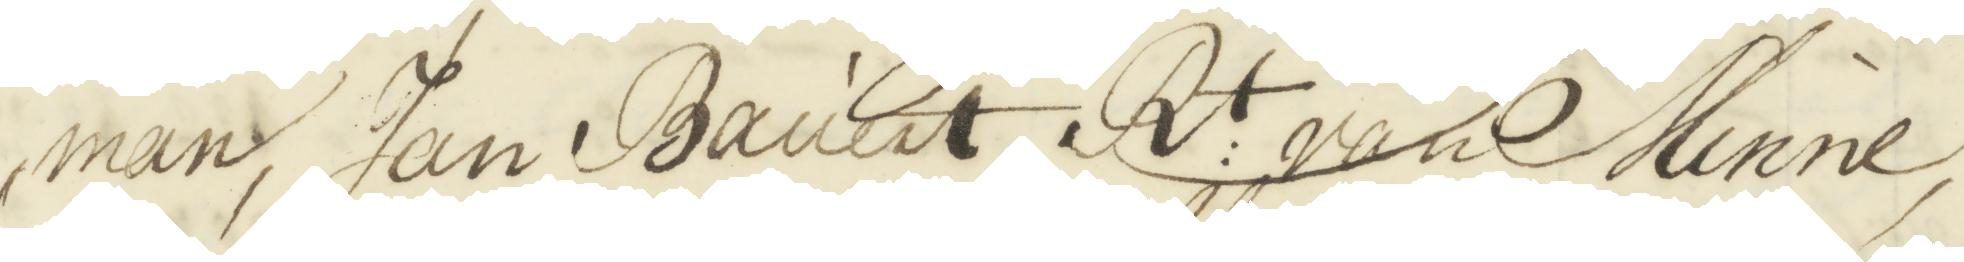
„man, Jan Bauert, R:t van Minne,
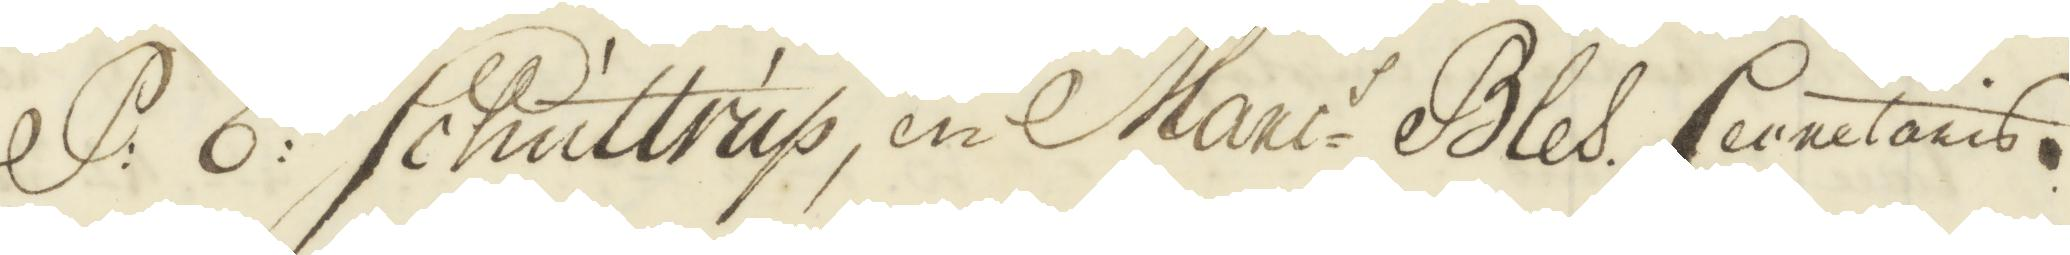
P: E: Schultrup, en Marc:s Bles. Secritaris.
